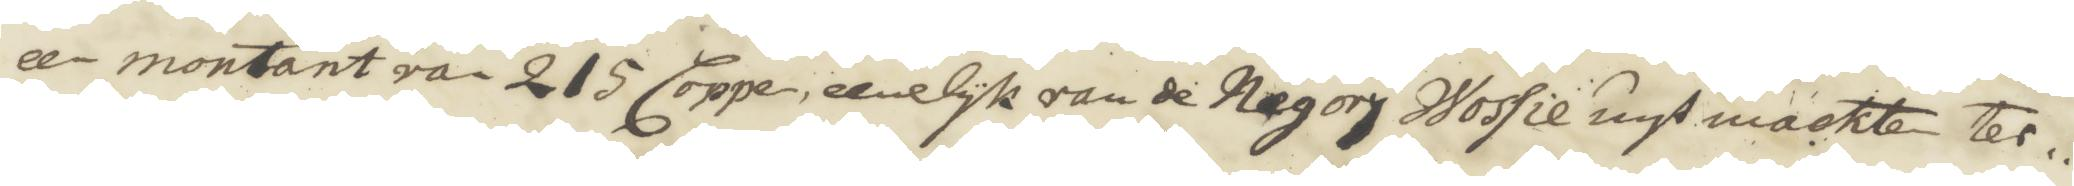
een montant van 215 Coppen, eenelijk van de negorij Wossie uyt maakten ter„
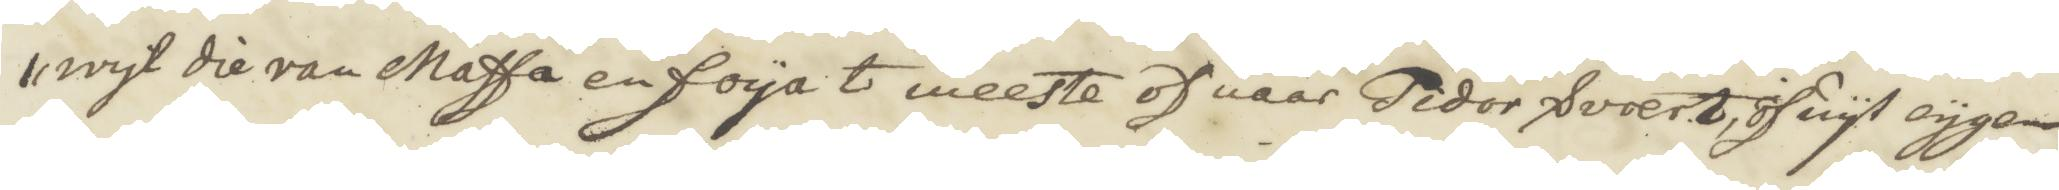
„wijl die van Maffa en foija t meeste of naar Tidor vervoert, of uijt eijgen
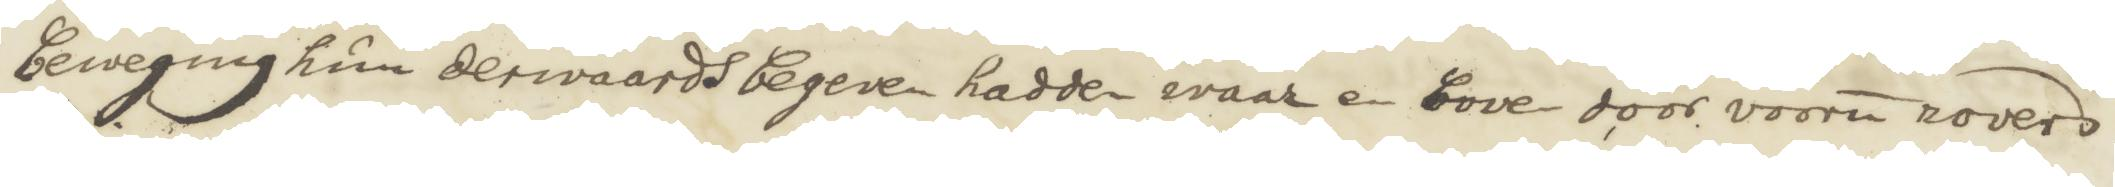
beweging hun derwaards begeven hadden waar en bove door voorn rovers
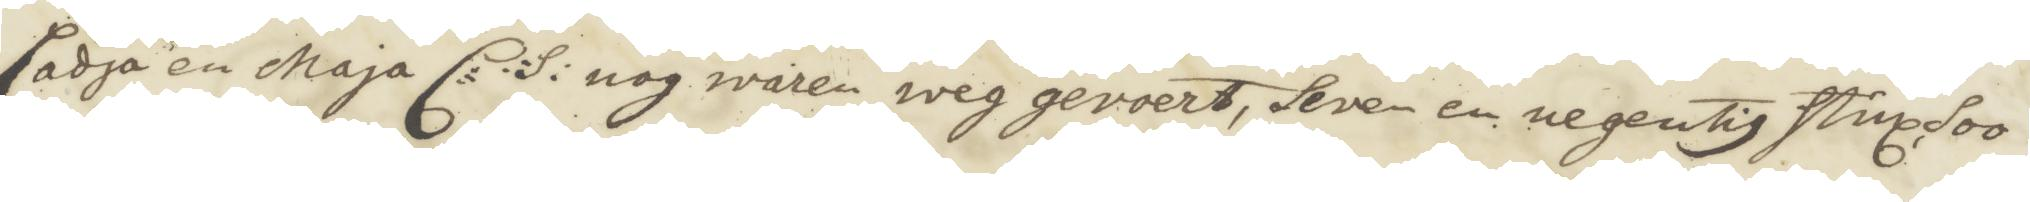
Cadja en Maja C: S: nog waren weg gevoert, seven en negentig stux, soo
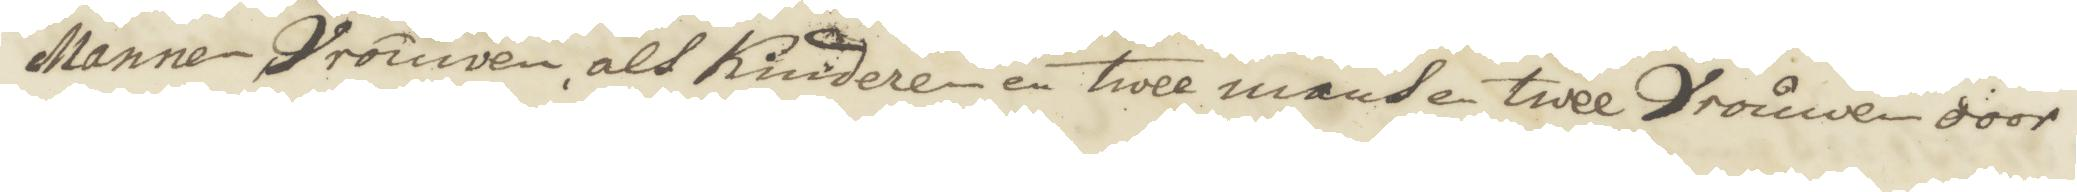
Mannen, Vrouwen, als kinderen en twee mans en twee Vrouwen door
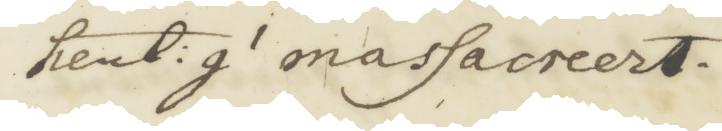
henl: g’massacreert.
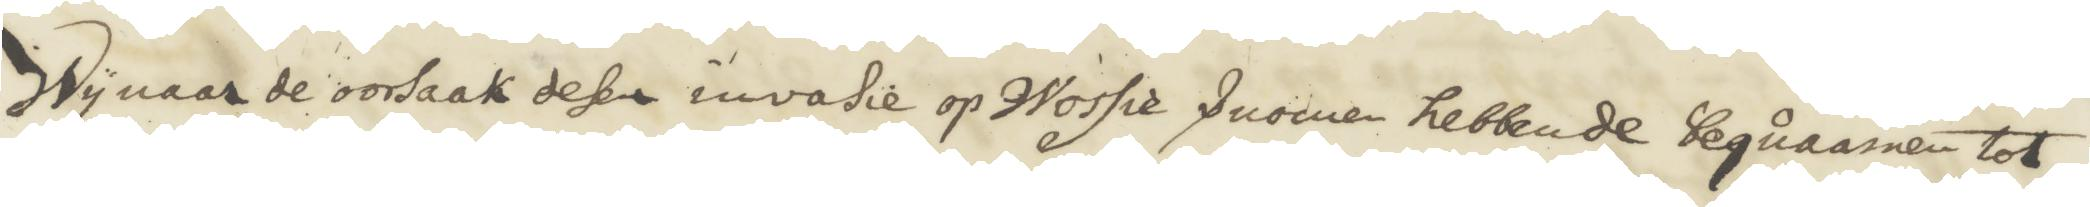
Wij naar de oorsaak desen invasie op Wossie vernomen hebbende bequaamen tot
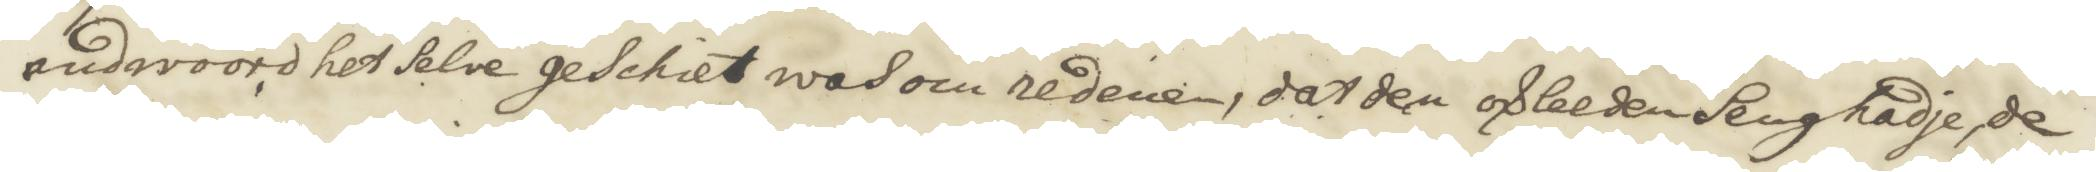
andwoord het selve geschiet was om redenen, dat den overleeden senghadje, de
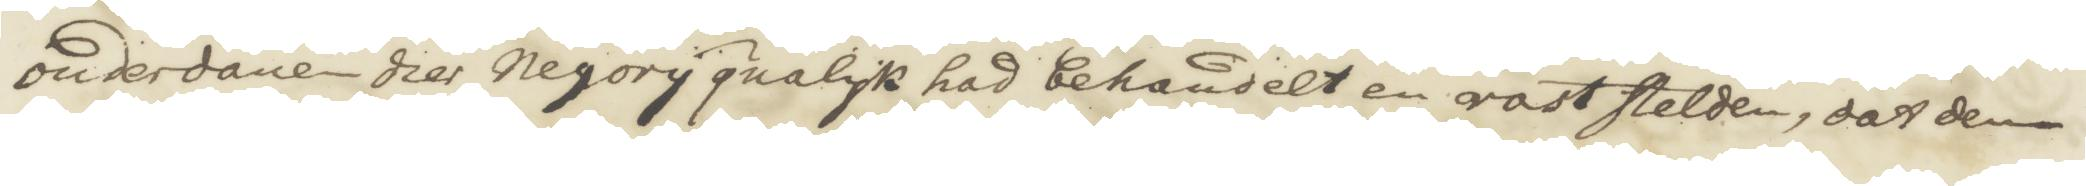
onderdanen dier negorij qualijk had behandelt en vaststelden, dat den
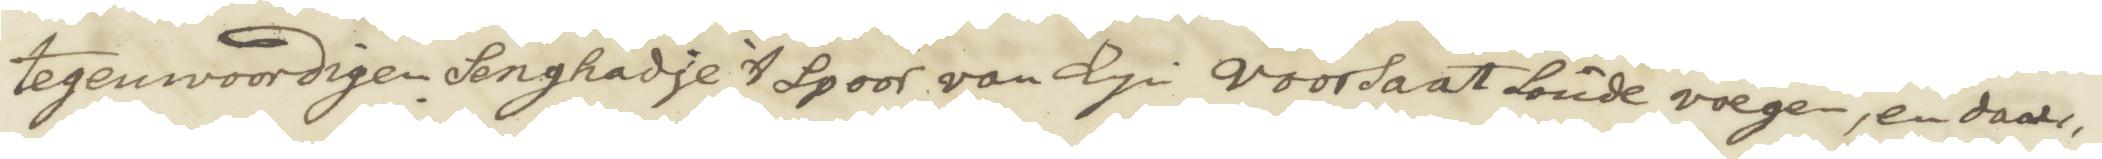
tegenwoordigen senghadje ’t spoor van zijn voorsaat soude voegen, en daar„
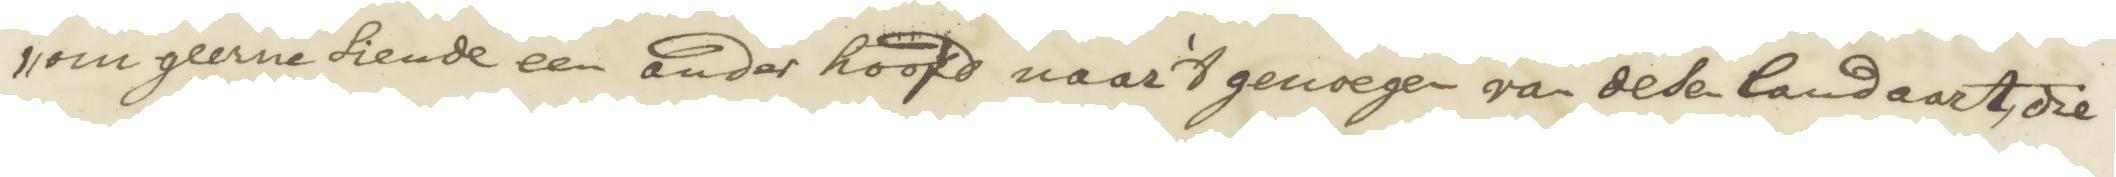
om geerne siende een ander hoofd naar ’t genoegen van dese landaart, die
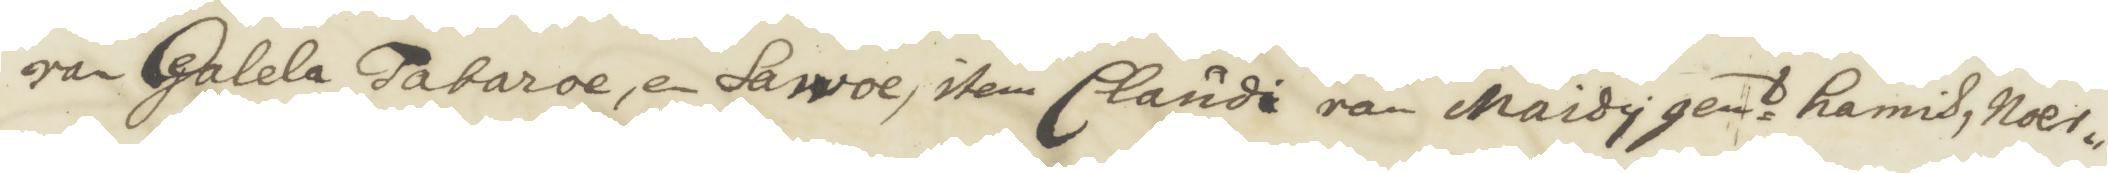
van Galela Tabaroe, en sawoe, item Claudi van Maidij gen=t hamis, noer
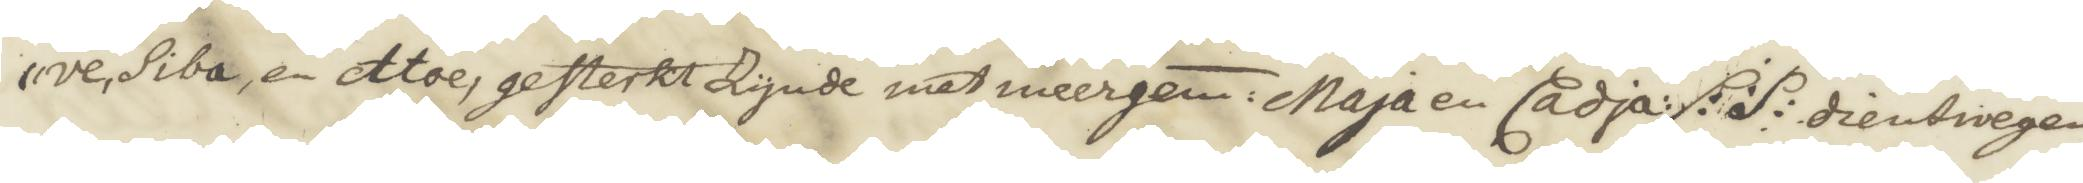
„ve siba, en Atoe, gesterkt zijnde met meergem: Maja en Cadja C: S: dientwegen
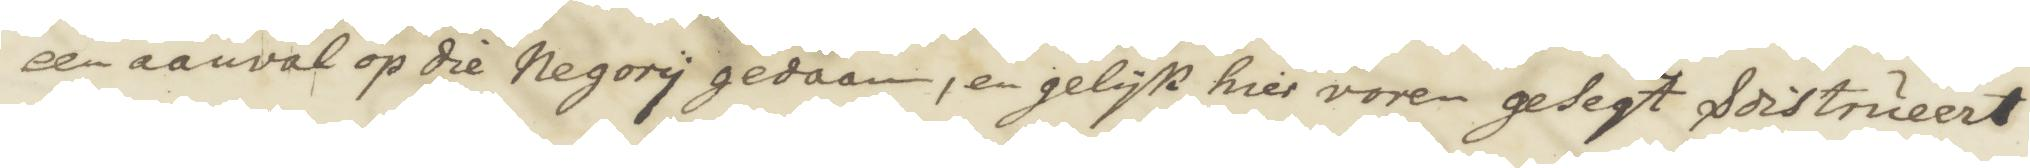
een aanval op die negorij gedaan, en gelijk hier voren gesegt verdistrueert
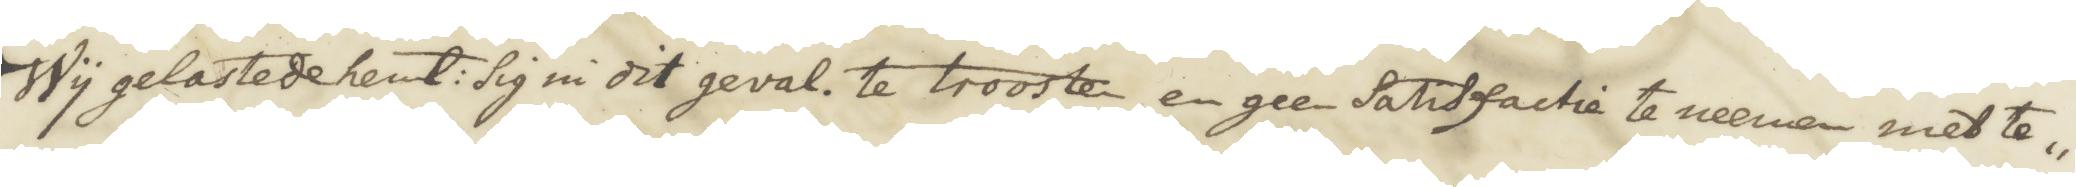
Wij gelastede henl: sig in dit geval. te troosten en geen satisfactie te neemen met te„
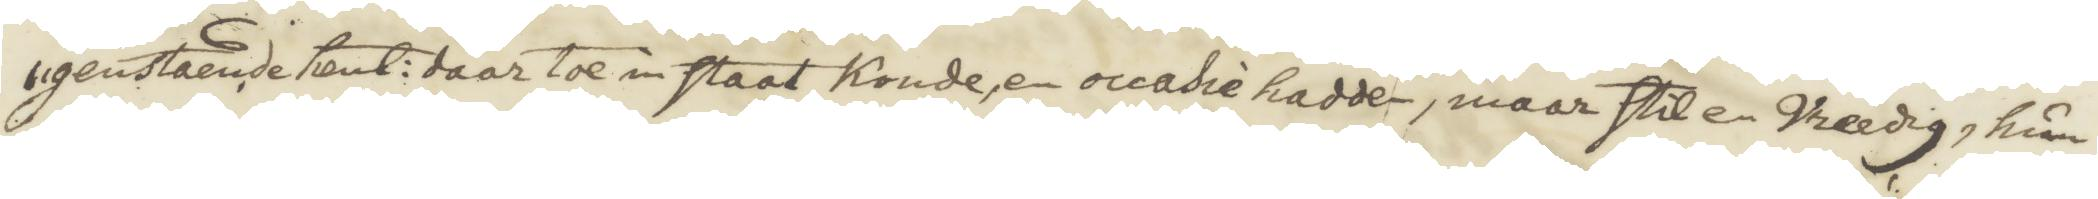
„genstaende henl: daar toe in staat konde, en occasie hadden, maar stil en vreedig, hun
